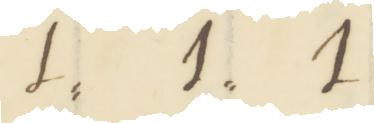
1„ 1„ 1
